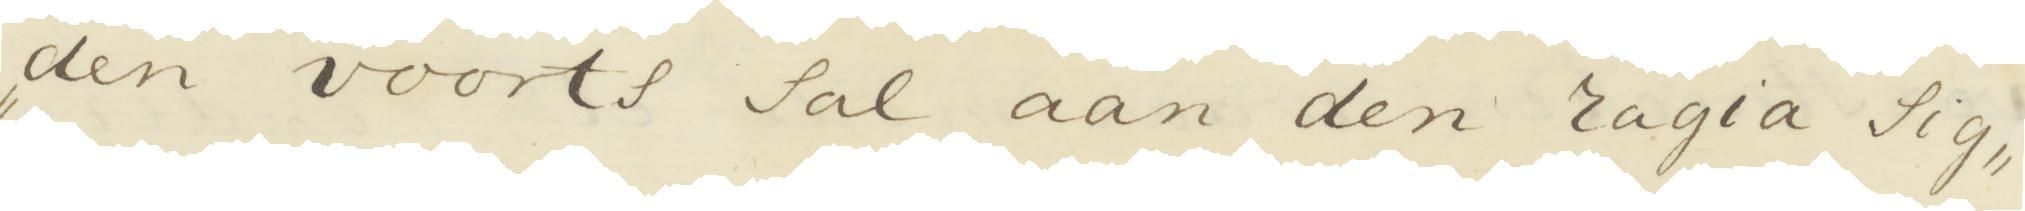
„den voorts sal aan den ragia sig„
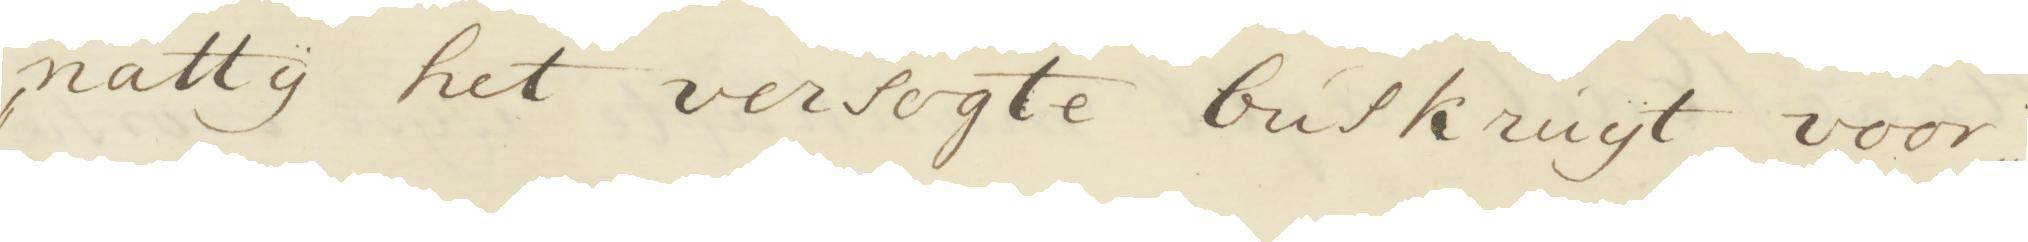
„nattij het versogte buskruijt voor„
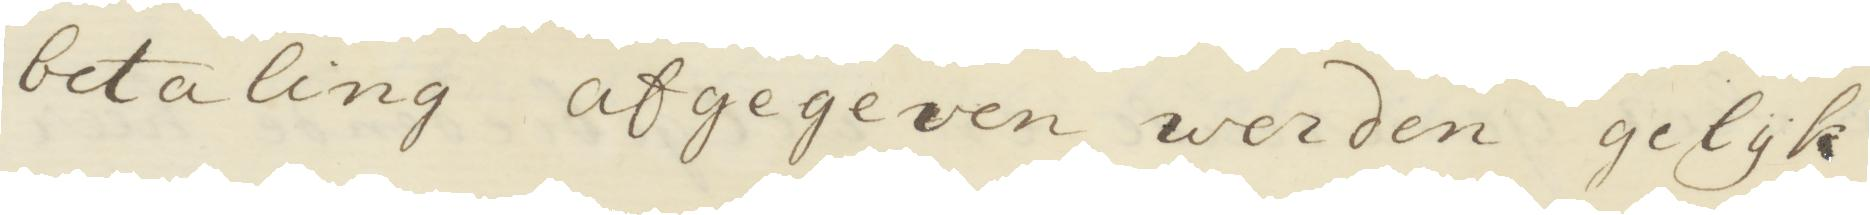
betaling afgegeven werden gelijk
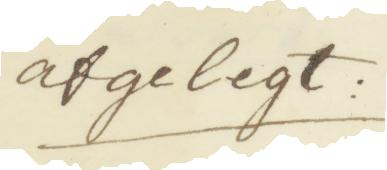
afgelegt.
